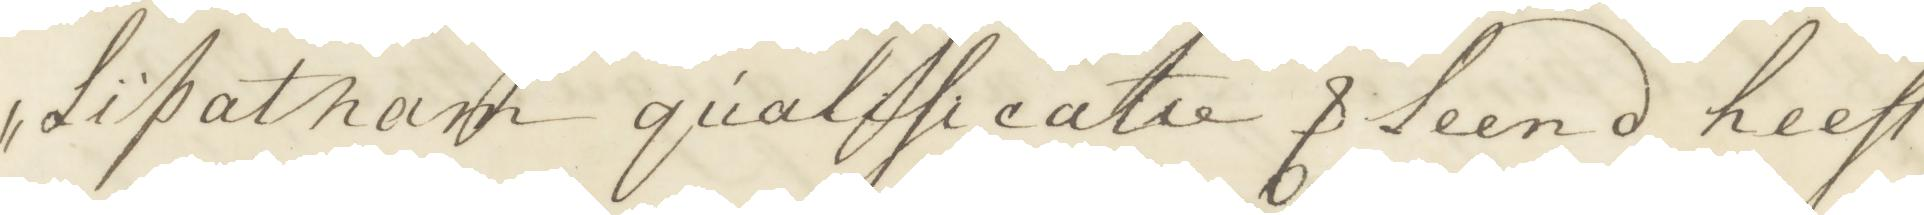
„lipatnam qualificatie verleend heeft
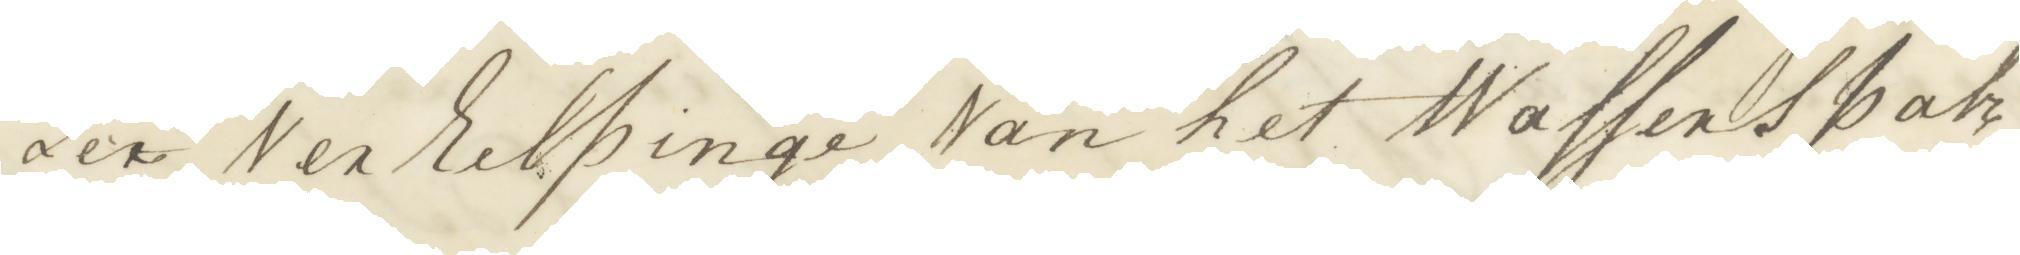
ter verhelpinge van het Wasserspak
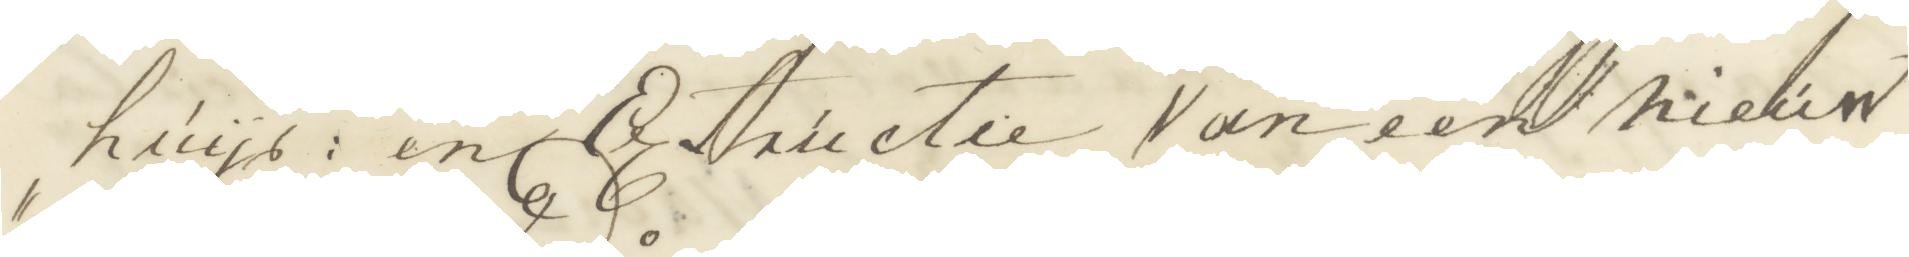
„huijs: en Extructie van een nieuw
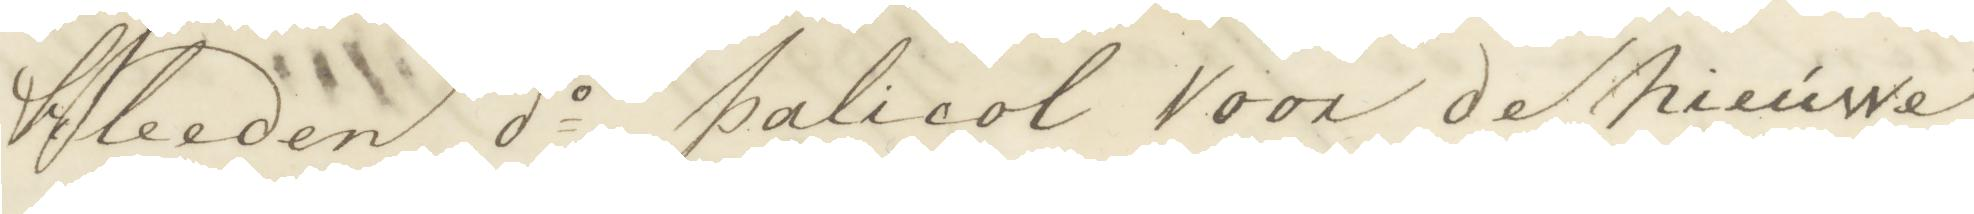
kleeden d=o palicol voor de nieuwe
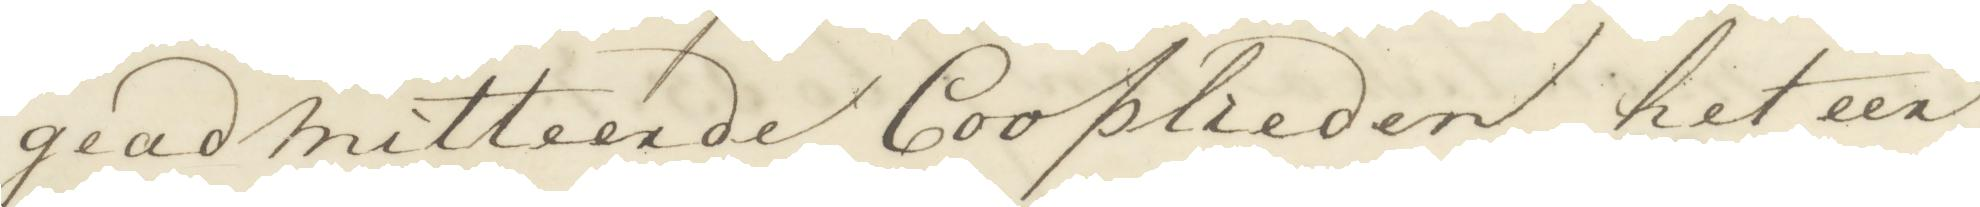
geadmitteerde Cooplieden, het eer
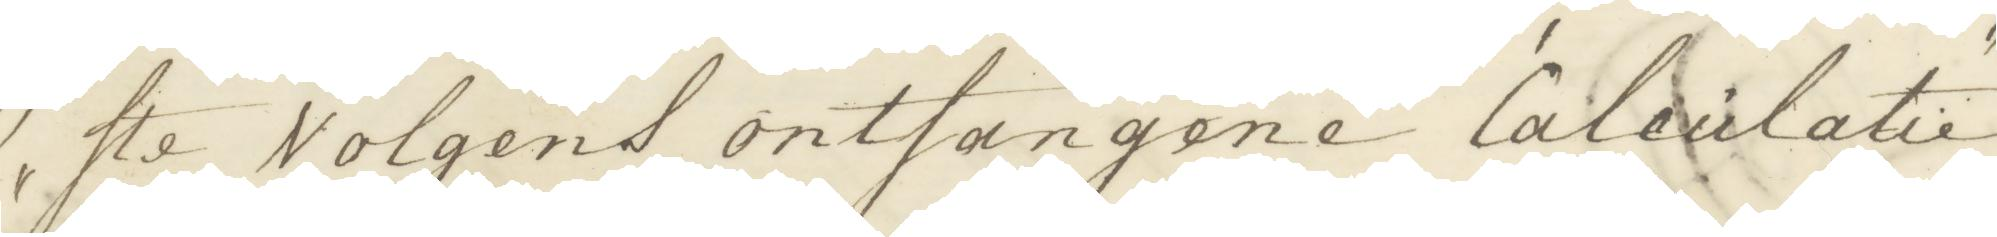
„ste volgens ontfangene Calculatie
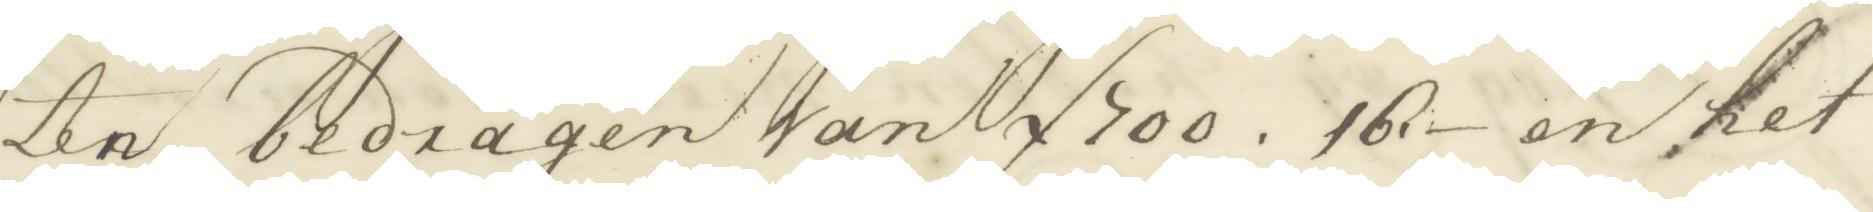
ten bedragen van ƒ700. 16.- en het
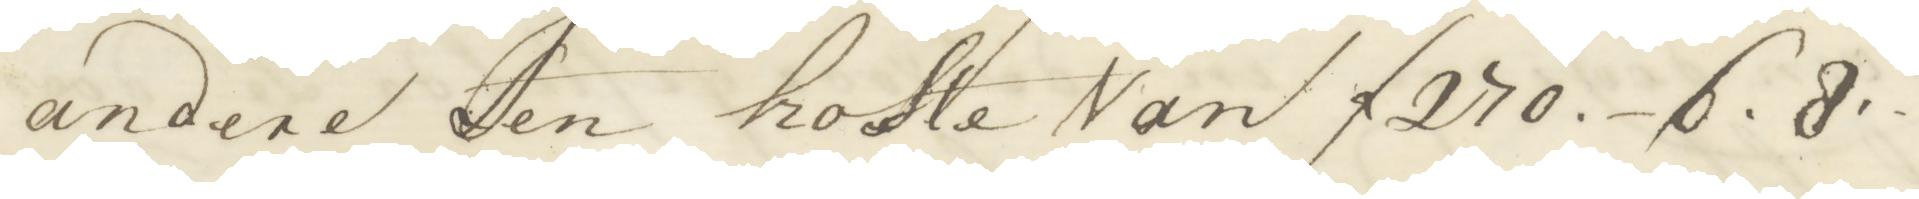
andere ten koste van ƒ270.–6. 8.
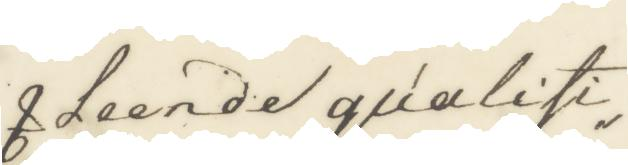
verleende qualifi„
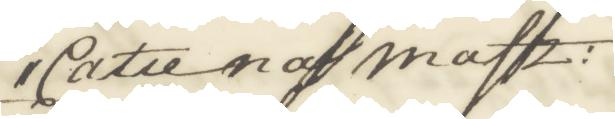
„catie na masz:
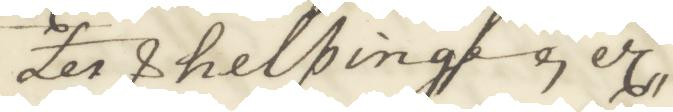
ter verhelpinge en ex„
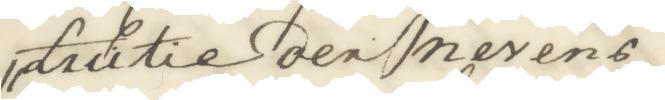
„trutie der nevens
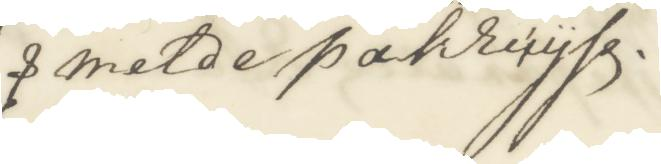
vermelde pakhuijsen.
